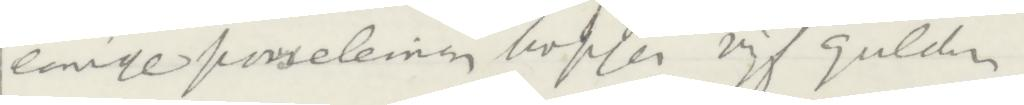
eenige porseleinen kopjes vijf gulden
